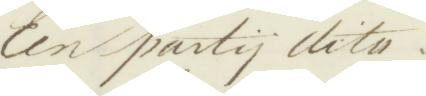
Een partij dito
